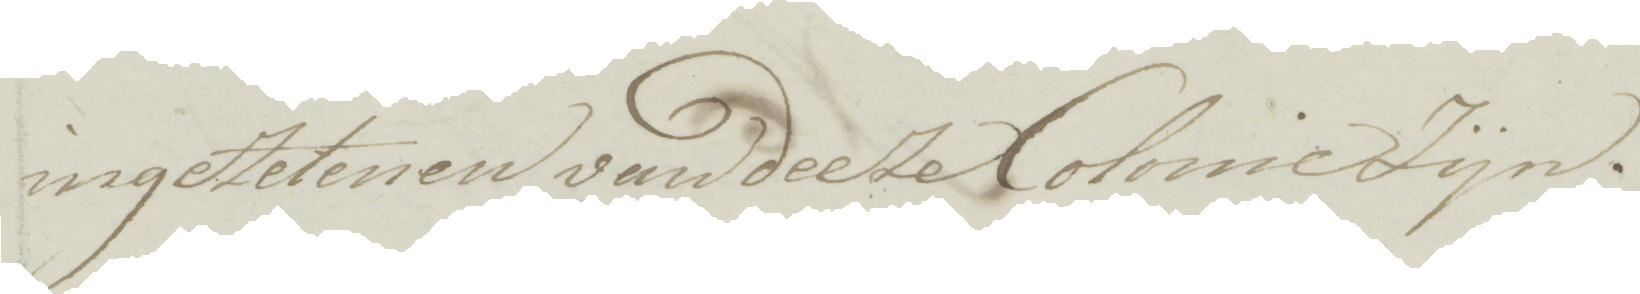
ingezetenen van deeze Colonie Zijn.
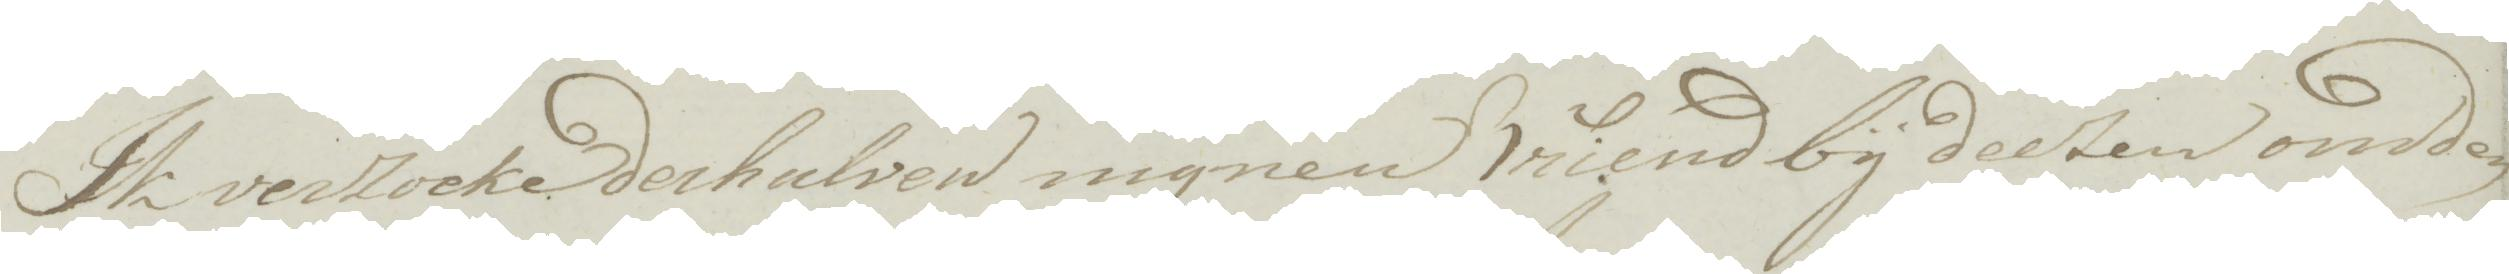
Ik verzoeke derhalven mijnen vriend bij deezen om den
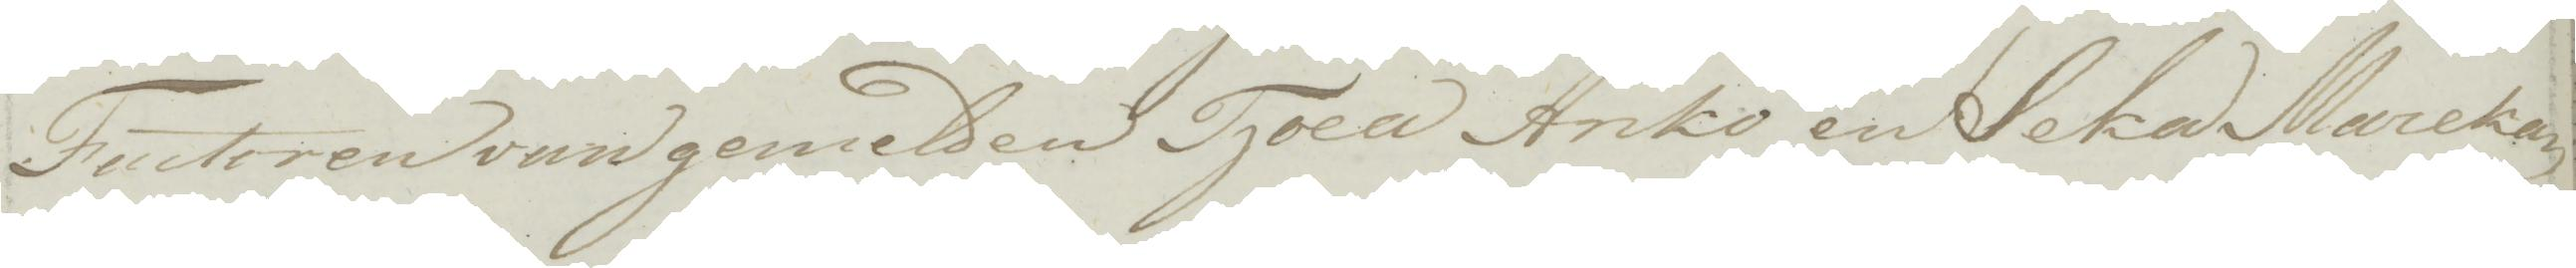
Factoren van gemelden Tjoea Anko en Seka Marekan
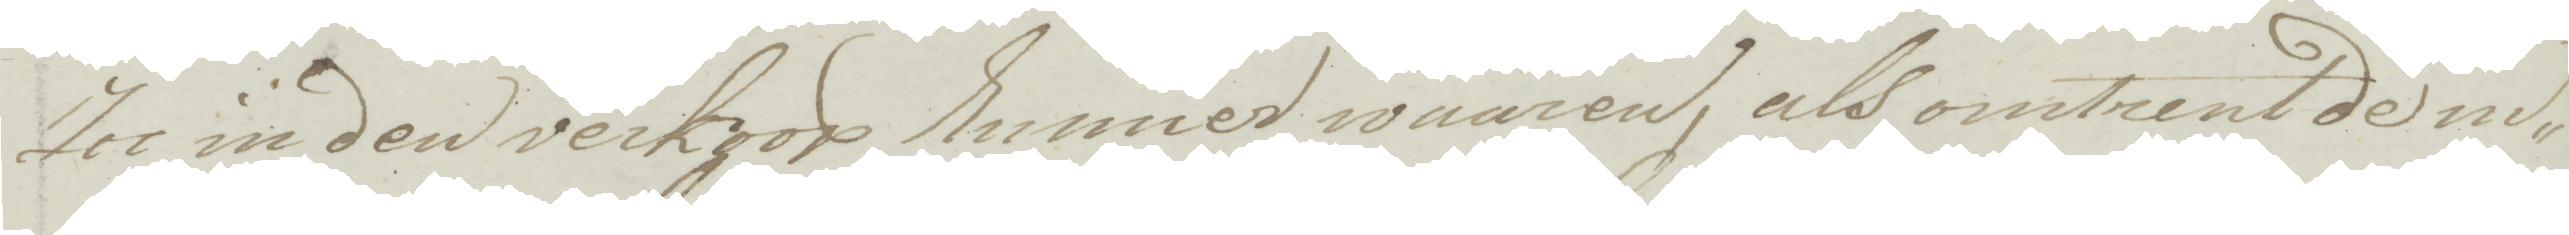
Zoo in den verkoop hunner waaren, als omtrent de in„
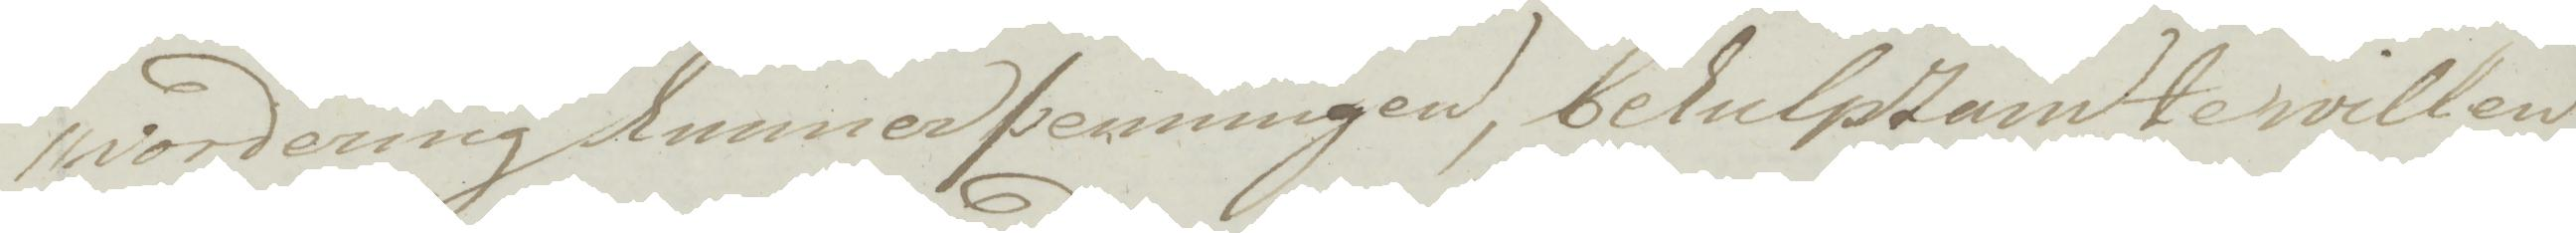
„vordering hunner penningen, behulpzam te willen
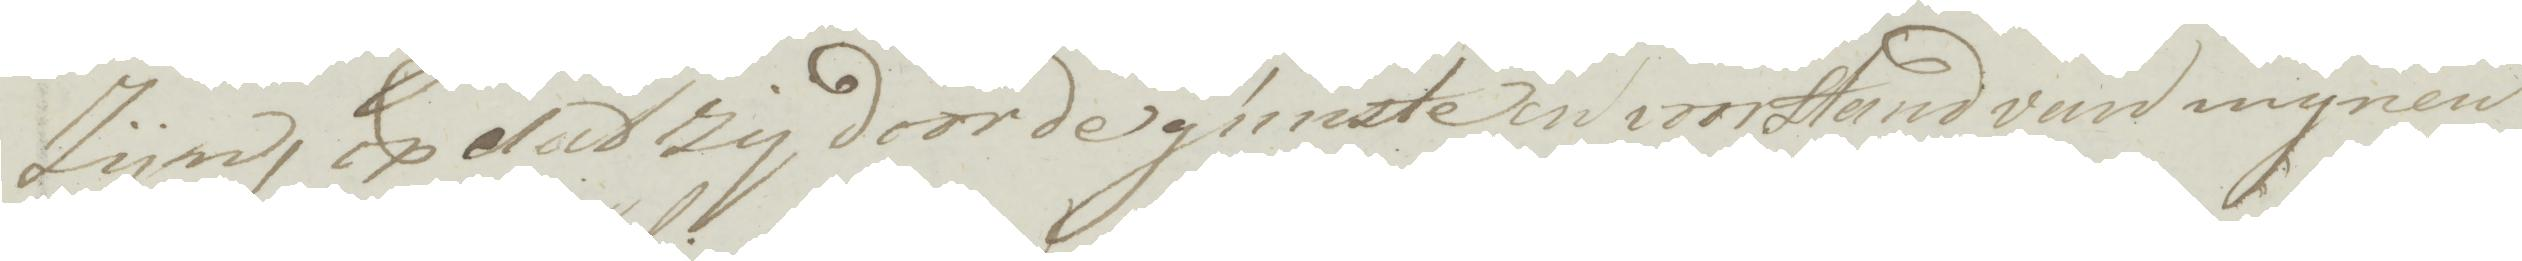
Zijn op dat zij door de gunste en voorstand van mijnen
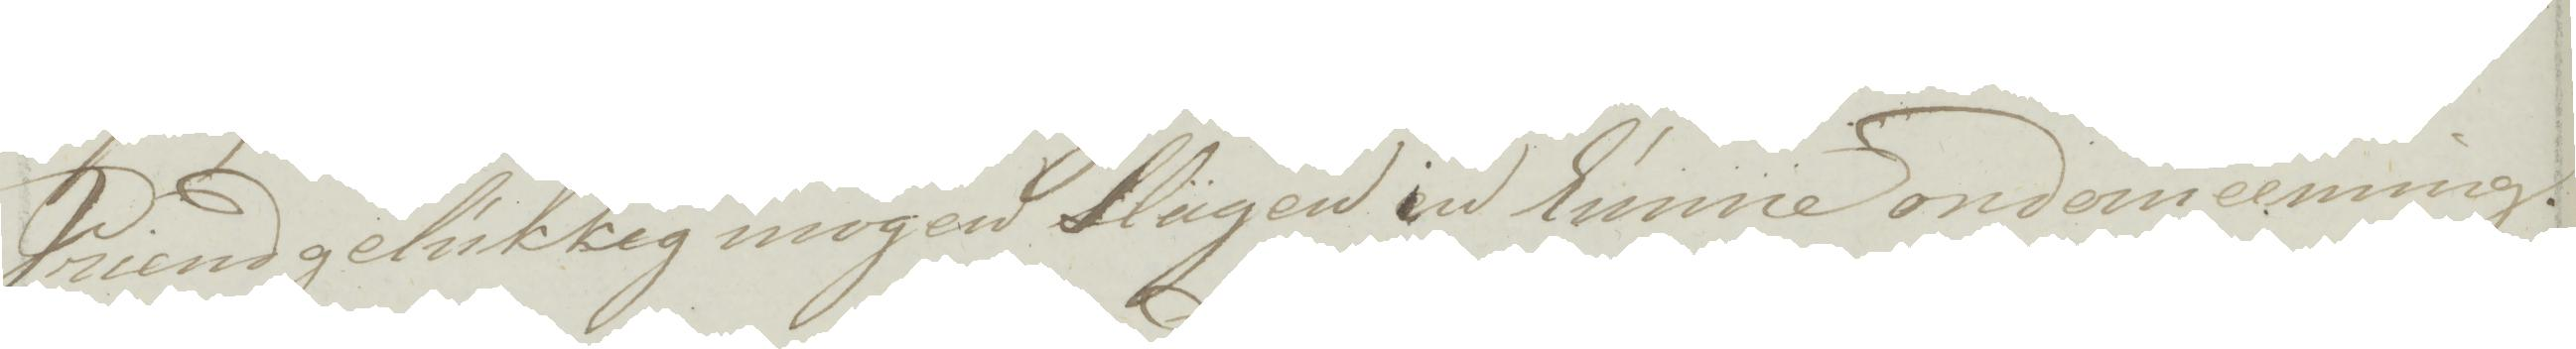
Vriend gelukkig mogens slägen in hunne onderneeming.
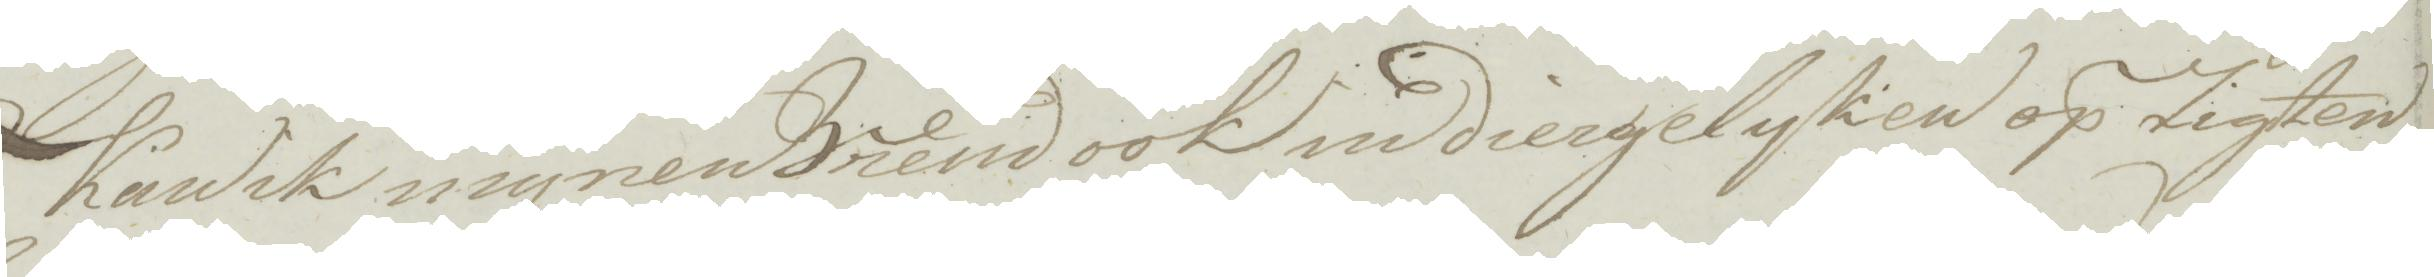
Kan ik mijnen Vrend ook in diergelyken op Zigten
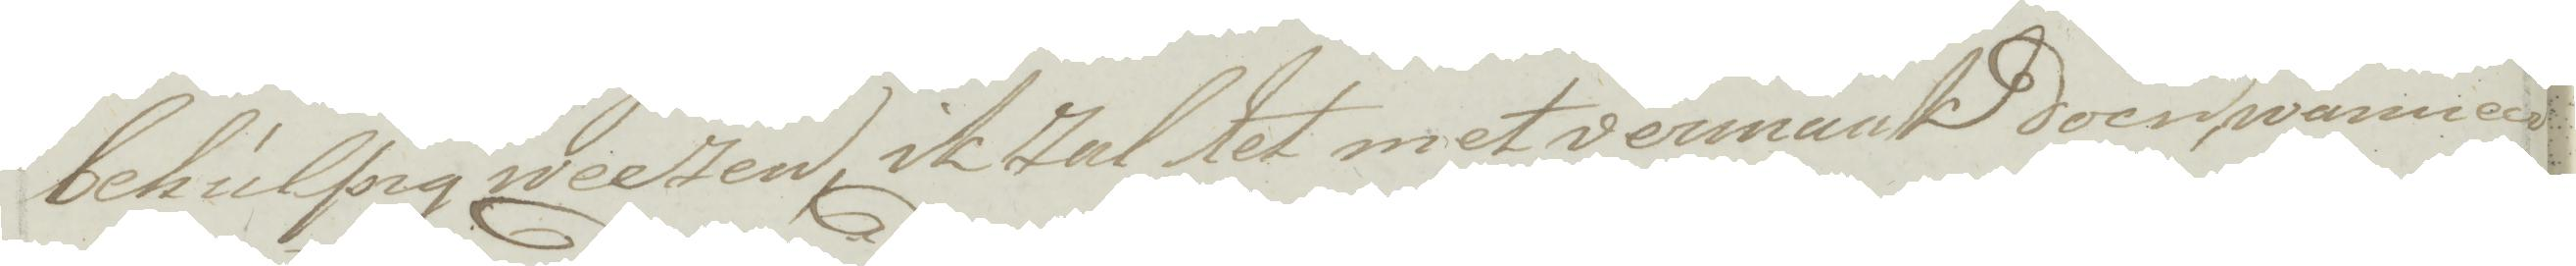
behulpig weezen, ik Zal het met vermaak Doen, wanneer
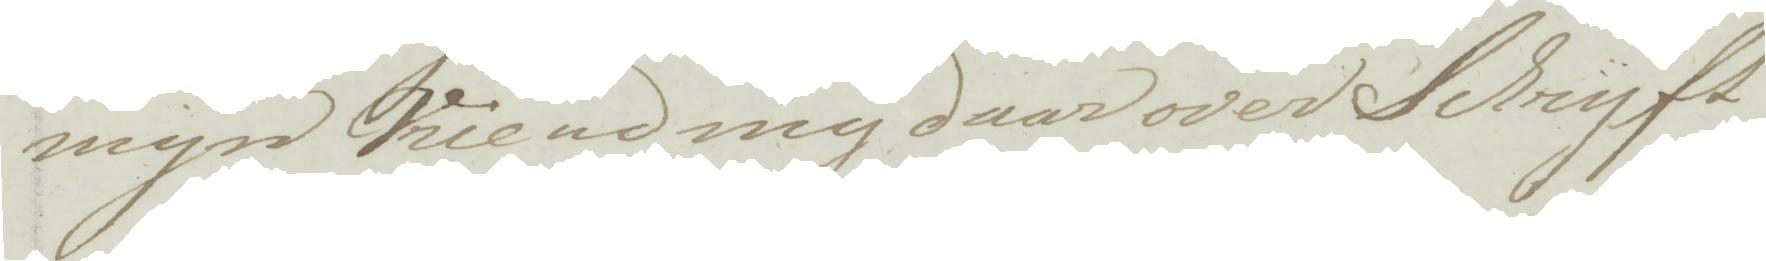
mijn Vriend mij daar over Schrijft
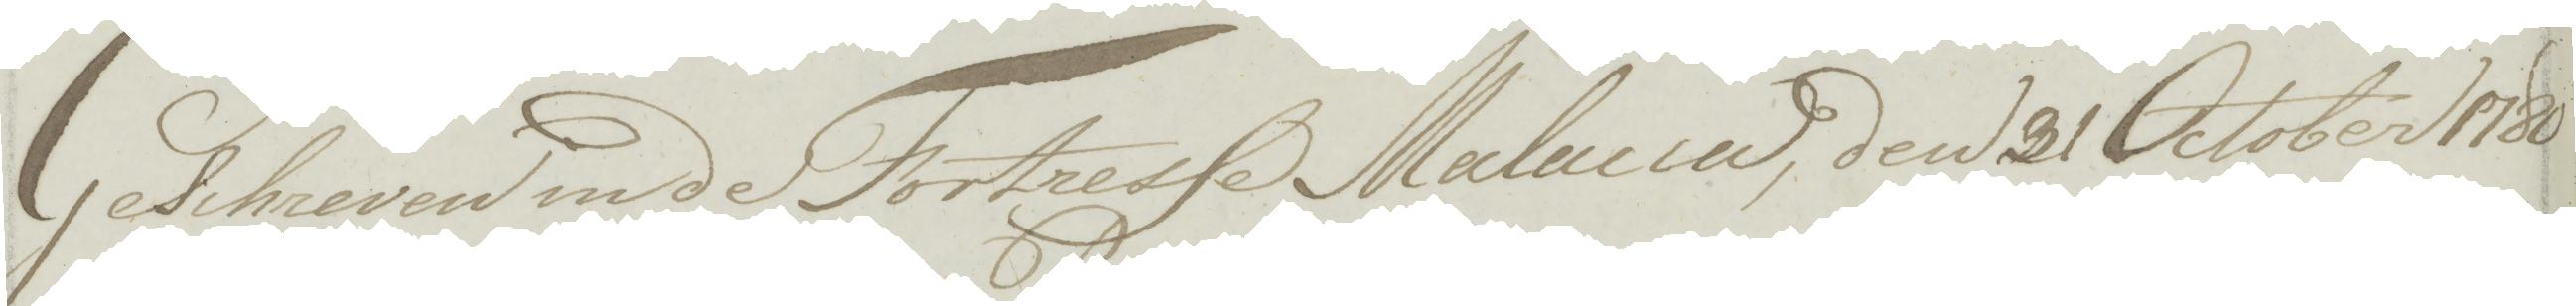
Geschreven in de Fortresse Malacca, den 31 October 1780
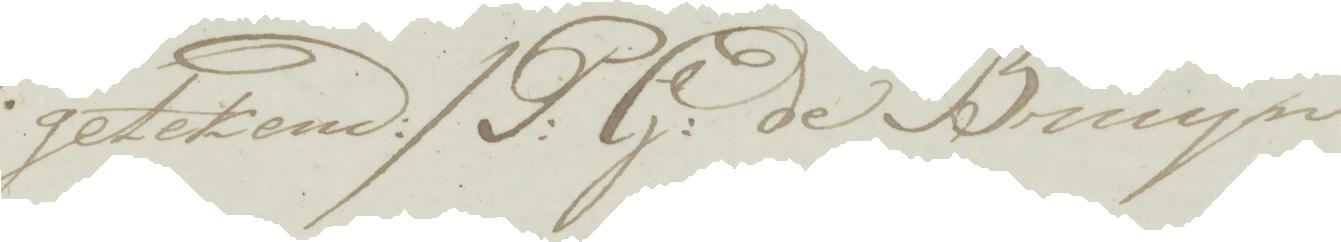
/:getekend:/ P: G: de Bruijn
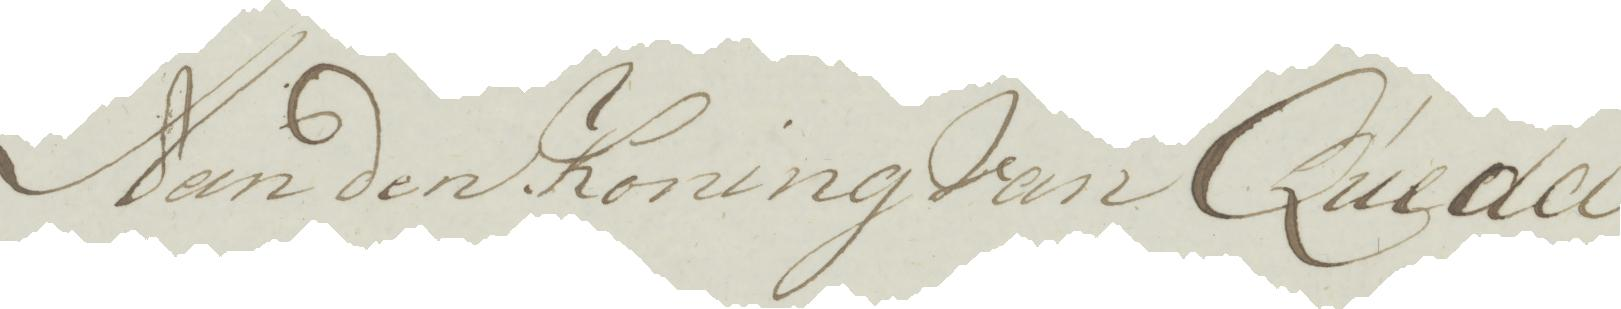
Van den Koning van Queda
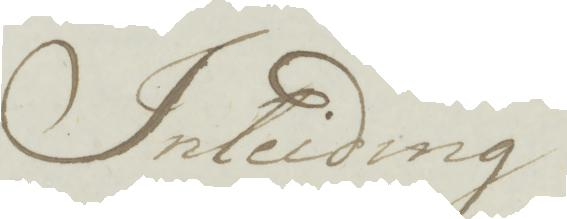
Inleiding!
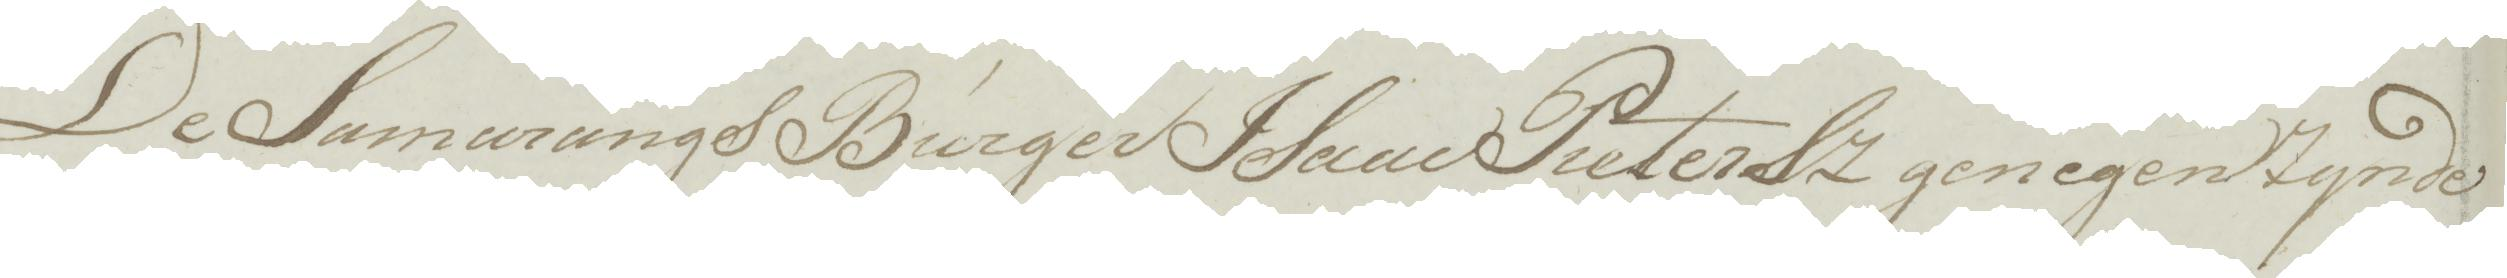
De Samarangs Burger Isaac Pietersz genegen Zynde
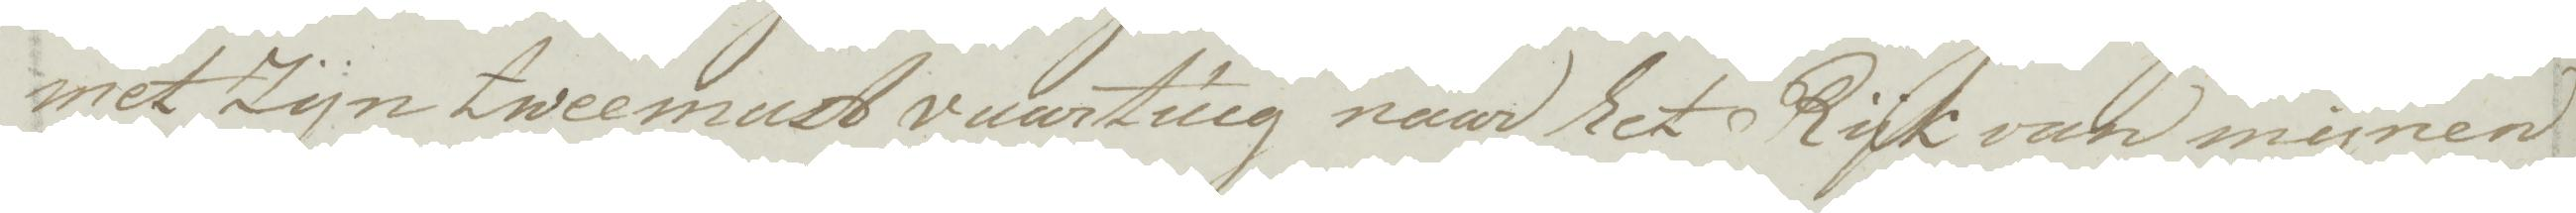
met Zijn tweemast vaartuig naar het Rijk van mijnen
